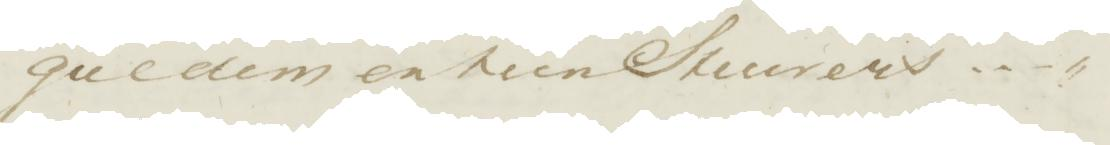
guldens en tien Stuivers - - - „
